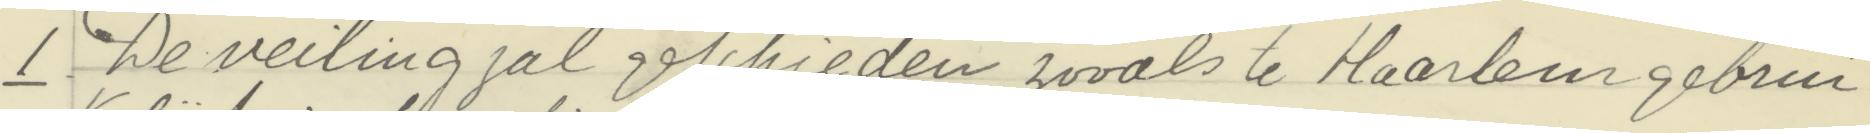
1. De veiling zal geschieden zooals te Haarlem gebrui
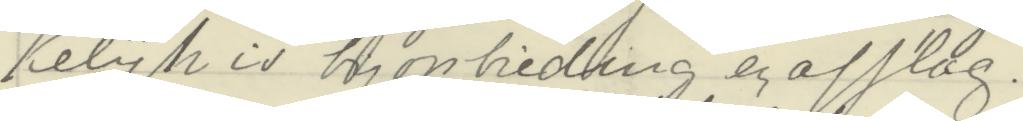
kelijk is by opbieding en afslag
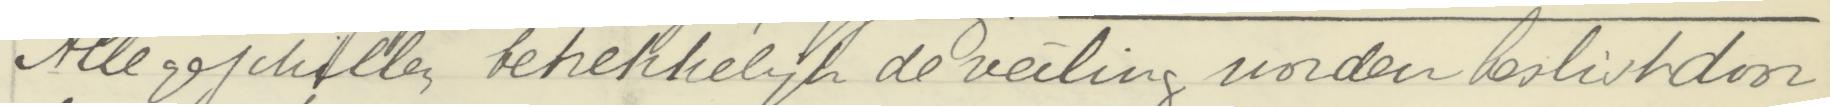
Alle geschillen betrekkelijk de veiling worden beslist door
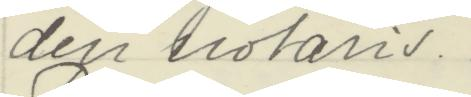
den notaris.
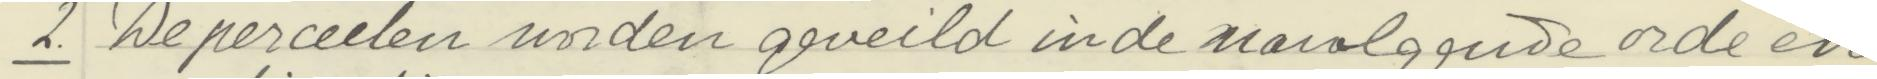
2. De perceelen worden geveild in de navolgende orde en
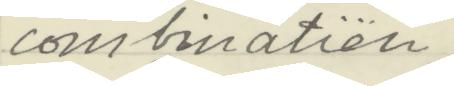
combinatiën
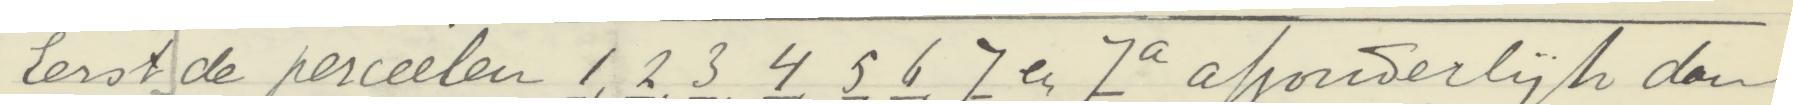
Eerst de perceelen 1, 2, 3, 4, 5, 6, 7 en 7a afzonderlijk dan
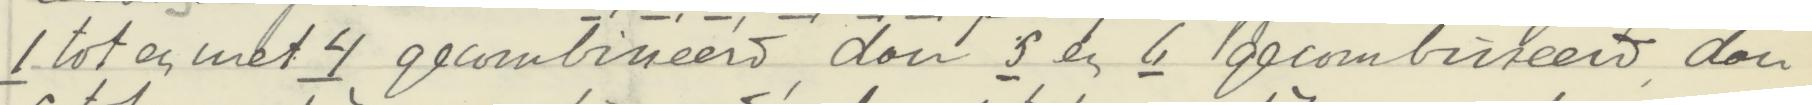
1 tot en met 4 gecombineerd dan 5 en 6 gecombineerd, dan
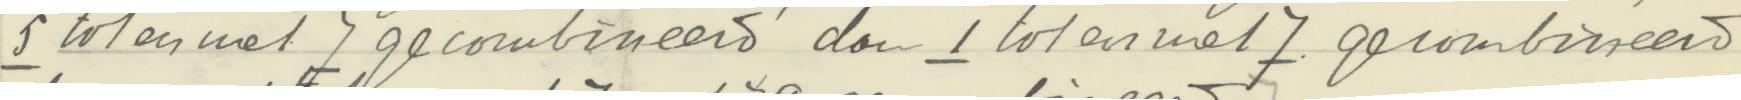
5 tot en met 7 gecombineerd dan 1 tot en met 7. gecombineerd
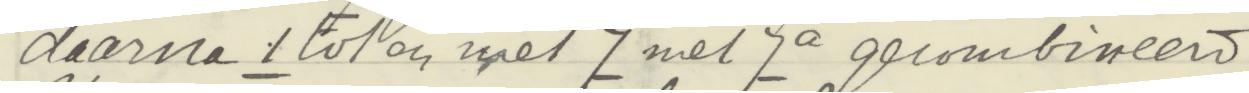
daarna 1 tot en met 7 met 7a gecombineerd
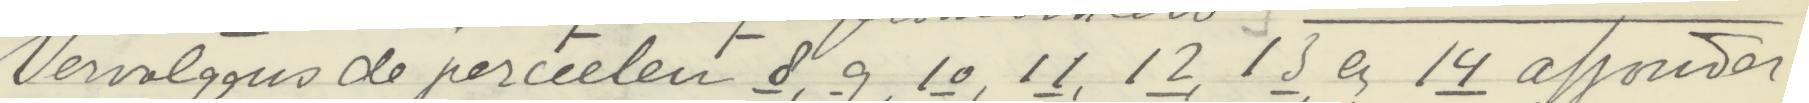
Vervolgens de perceelen 8, 9, 10, 11, 12, 13 en 14 afzonder-
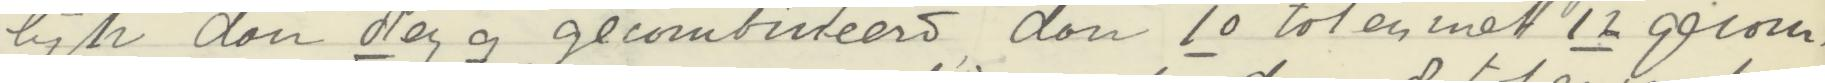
lijk, dan 8 en 9 gecombineerd, dan 10 tot en met 12 gecom
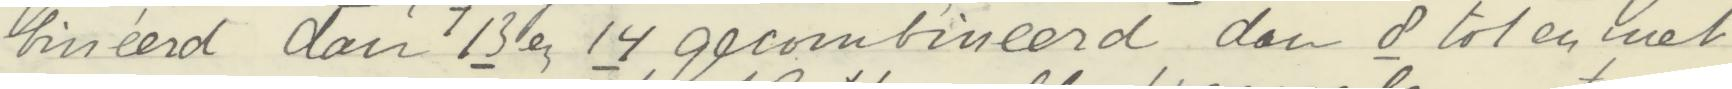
bineerd dan 13 en 14 gecombineerd, dan 8 tot en met
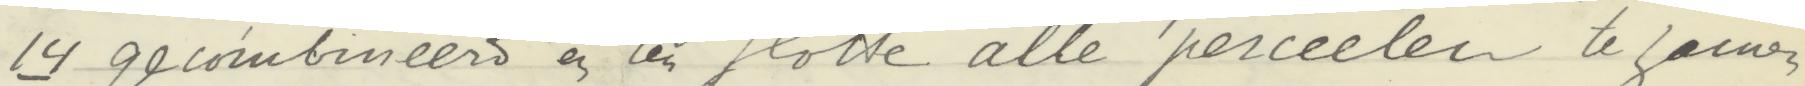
14 gecombineerd en ten slotte alle perceelen te zamen
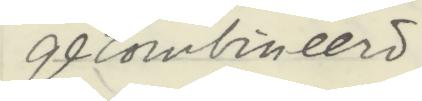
gecombineerd
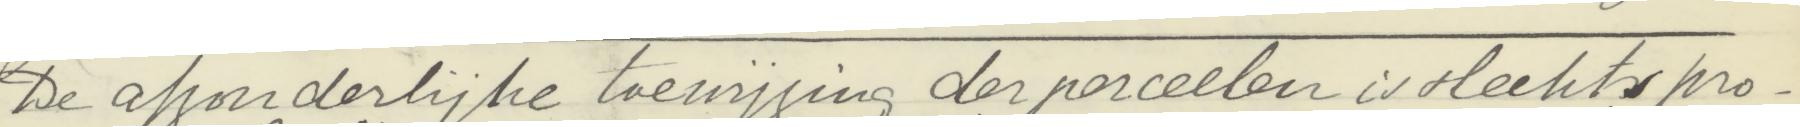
De afzonderlijke toewijzing der perceelen is slechts pro-
